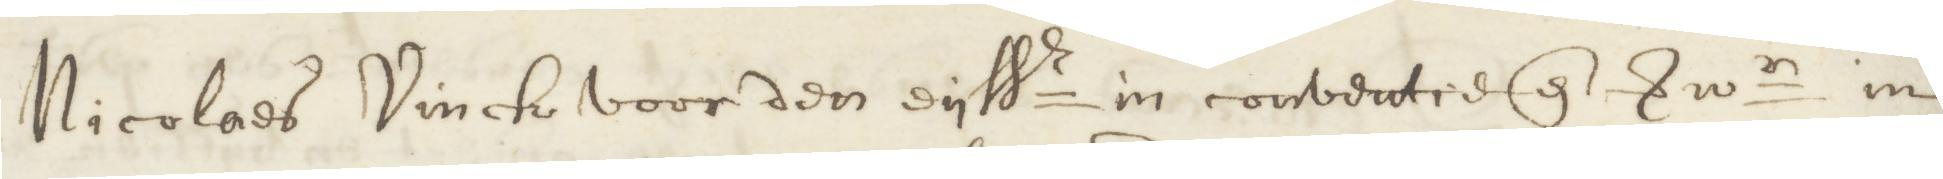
Nicolaes Vinck voor den eijss=r in conventie ende verw=r in
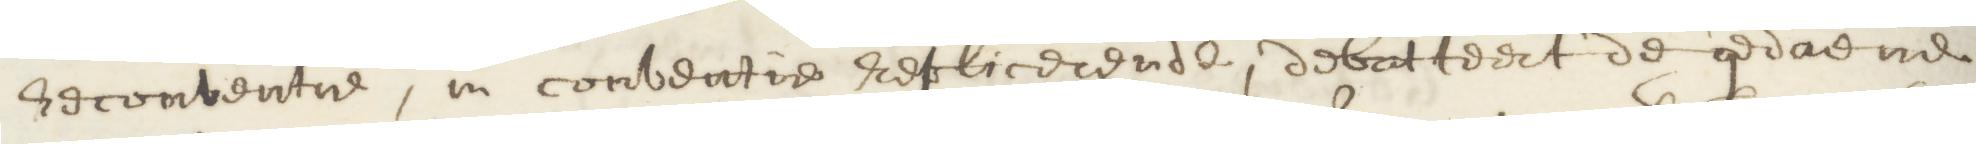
reconventie, in conventie replicerende, debatteert de gedaene
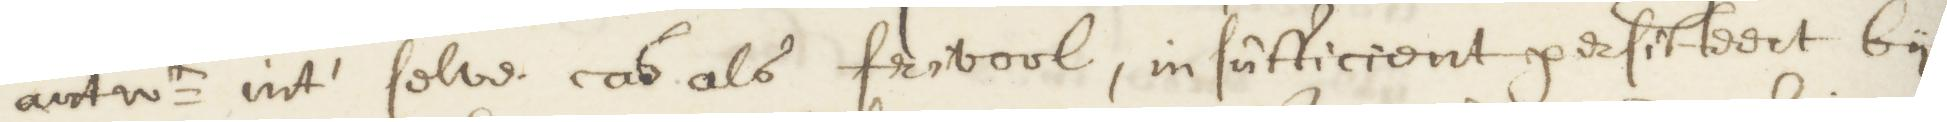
antw=t int' selve cas als frivool, in sufficient persisteert bij
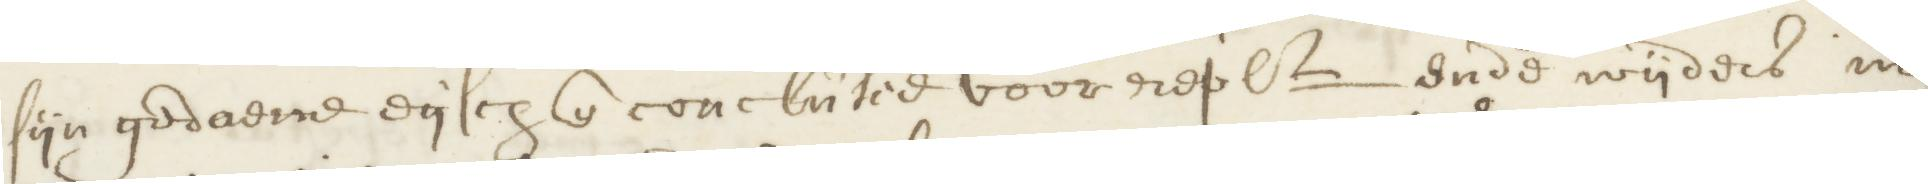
sijn gedaene eijsch te conclusie voor replijk ende wijders in
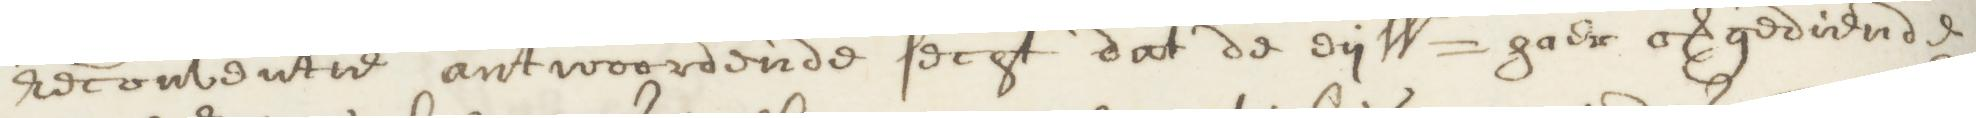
reconventie antwoordende secht dat de eijss=ce haer overgediende
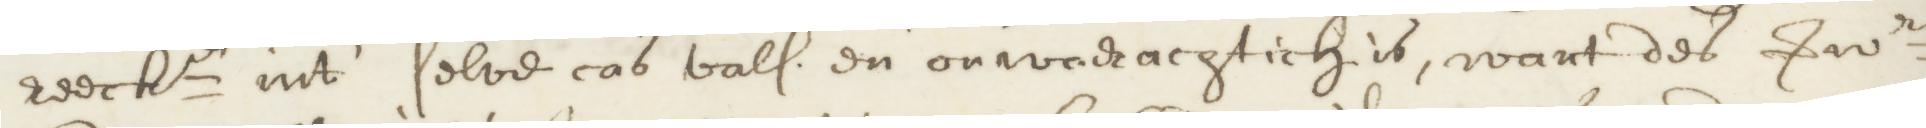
reeck=e int' selve cas vals. en onwaerachtich is, want des verw=rs
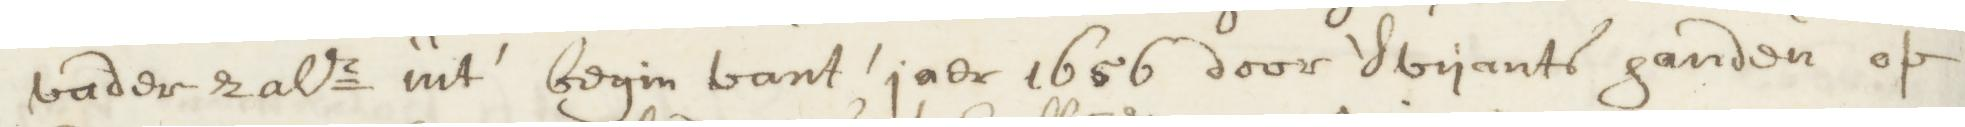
vader zal=r int' begin vant 'jaer 1656 door 's vijants handen op
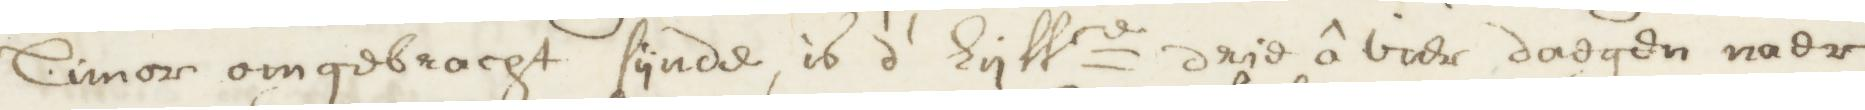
Timor omgebracht sijnde, is d eijss=re drie â vier daegen naer
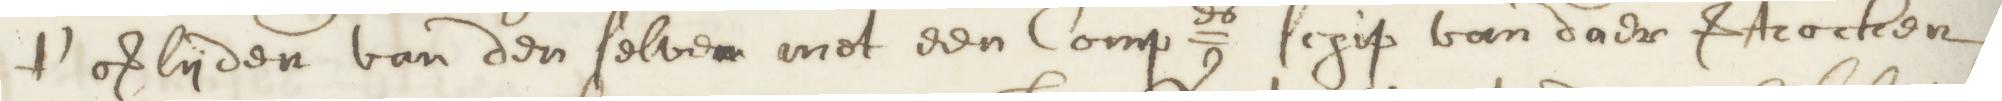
t' overlijden van den selver met een Comp=es schip van daer vertrocken,
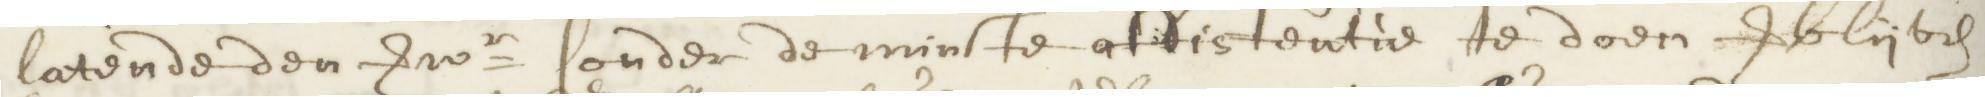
latende den verw=r sonder de minste assistentie te doen verblijven
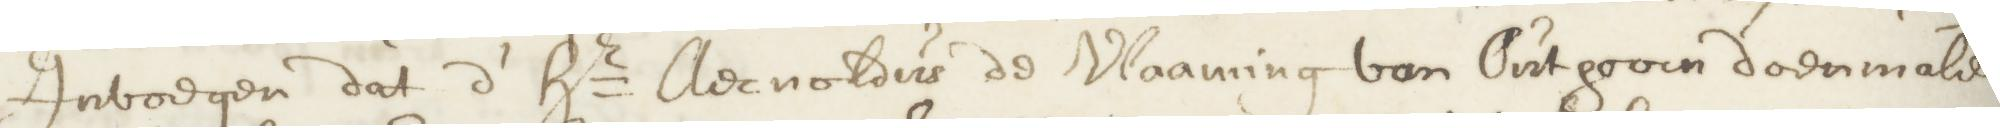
Jnvoegen dat d’ H=r Aernoldus de Vlaaming van Outhoorn doenmalen
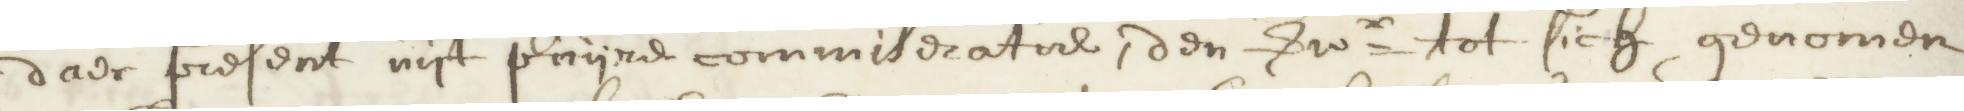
daer present uijt puijre commiseratie, den verw=r tot sich genomen
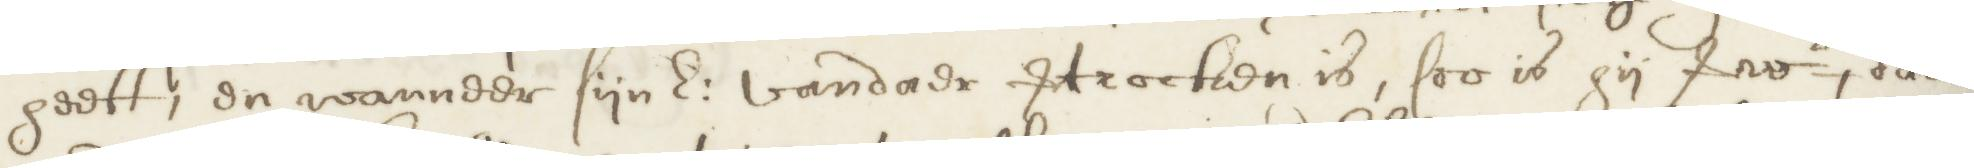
heeft, en wanneer sijn E: van daer vertrocken is, soo is hij verw=r, daer
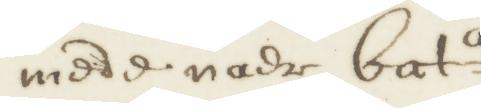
mede naer bat=a genavigeert, als wanneer h=ren Weesm=ren desen
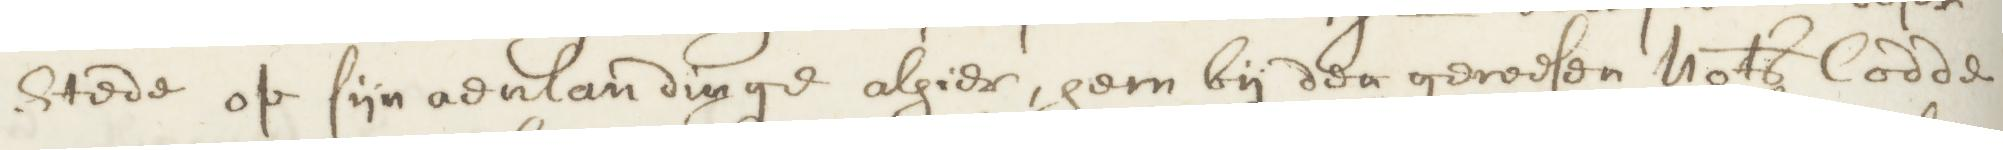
stede op sijn aenlandinge alhier, hem bij den gewesen Nots Codde
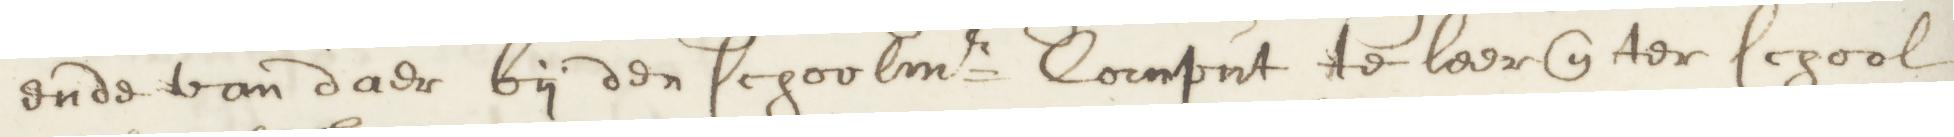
ende van daer bij den schoolm=r Cornput te leer ende ter school
